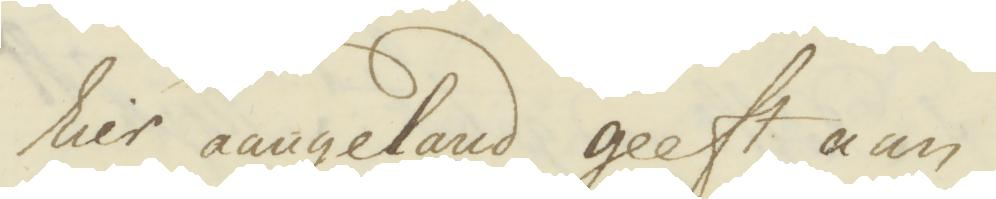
hier aangeland geeft aan
